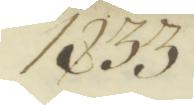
1833
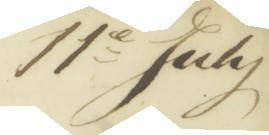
11=e July
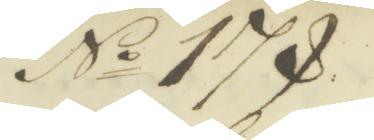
N=o 178.
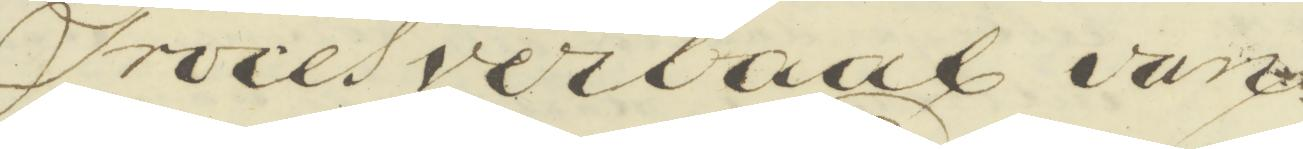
Proces verbaal van
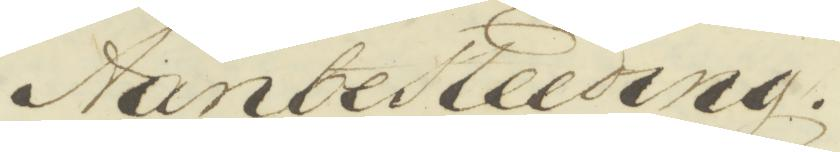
Aanbesteeding.
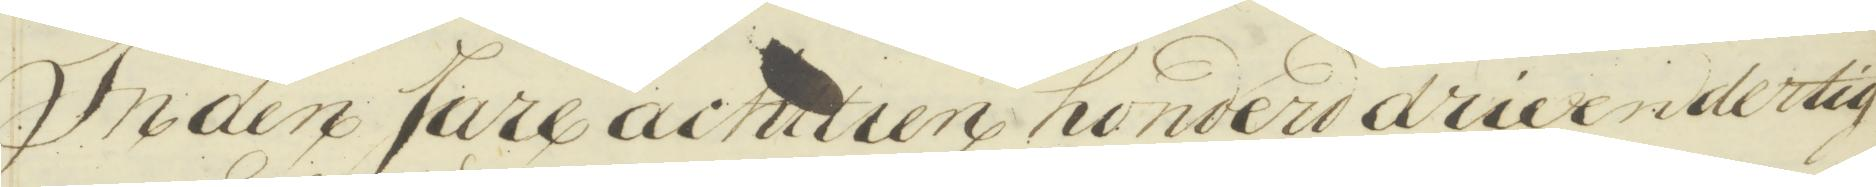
In den Jare achttien honderd drie en dertig
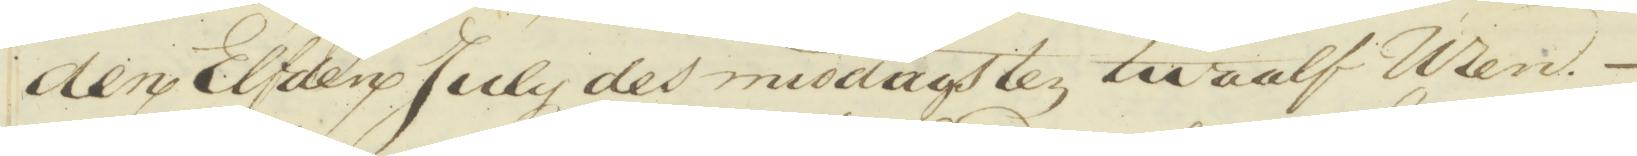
den Elfden July des middags ten twaalf Uren.-
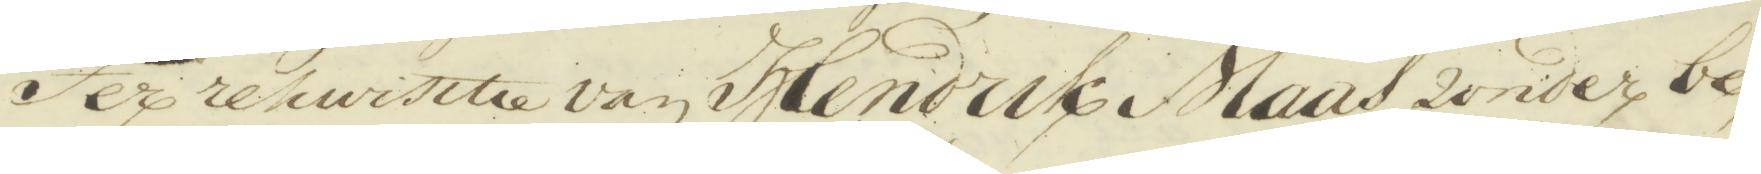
Ter rekwisitie van Hendrik Maas, zonder be
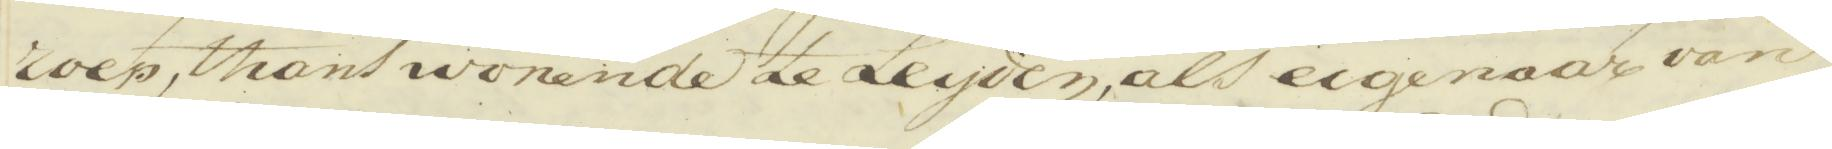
roep, thans wonende te Leyden, als eigenaar van
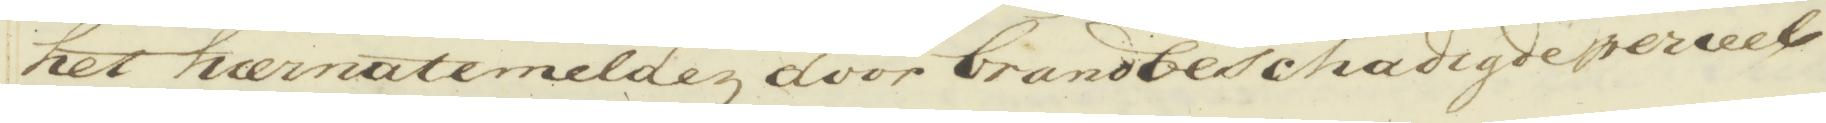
het hiernatemelden door brand beschadigde perceel
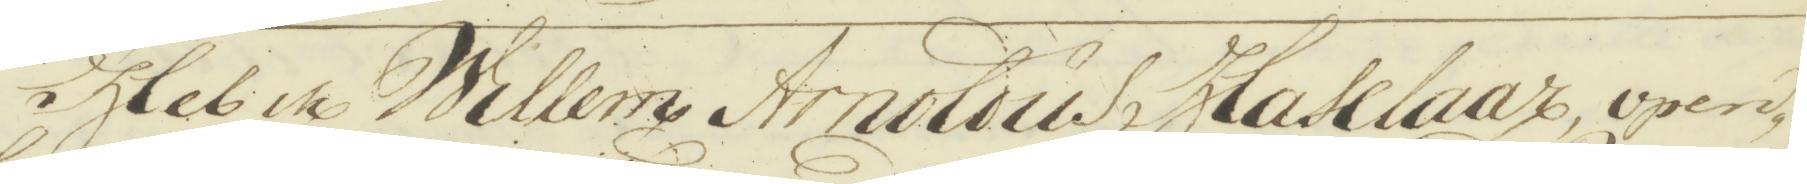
Heb ik Willem Arnoldus Haselaar, open„
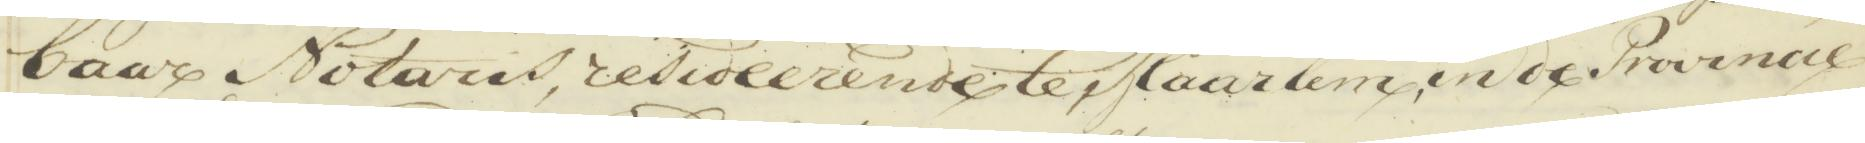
baar Notaris, resideerende te Haarlem, in de Provincie
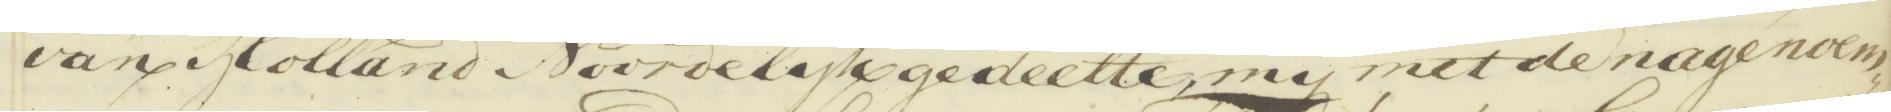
van Holland Noordelyk gedeelte, mij met de nagenoem„
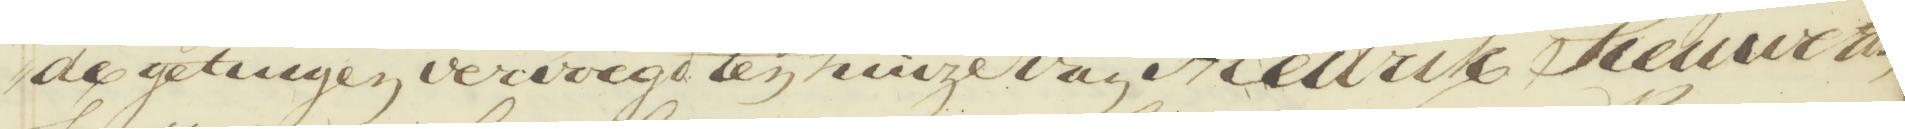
„de getuigen vervoegd ten huize van Fredrik Sieuwerts
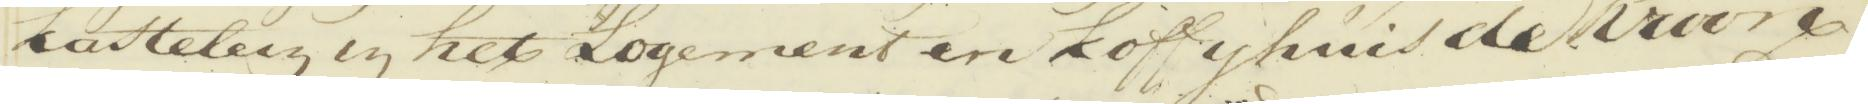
kastelein in het Logement en koffijhuis de Kroon
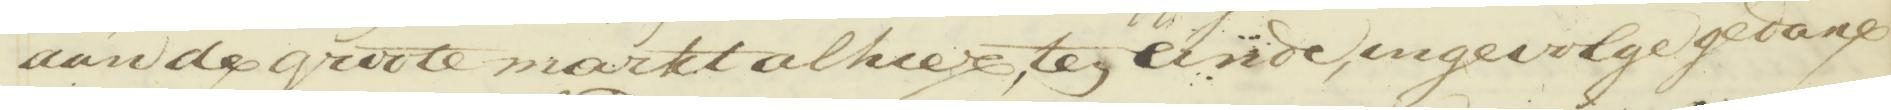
aan de groote markt alhier, ten einde, ingevolge gedane
